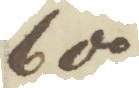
6 do
